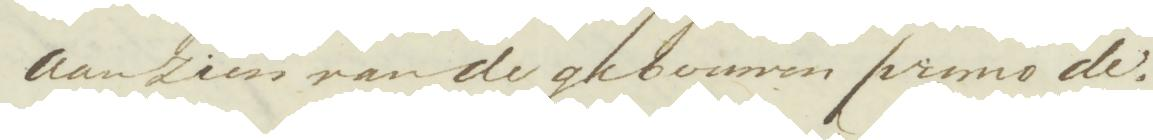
aanzien van de gebouwen primo de„
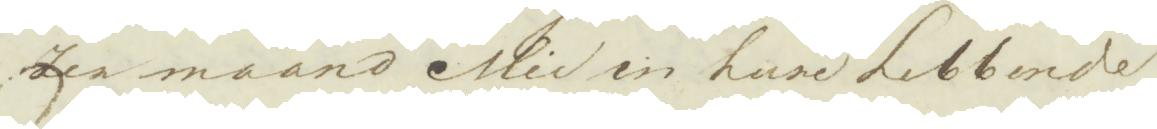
zen maand Mei in hure hebbende
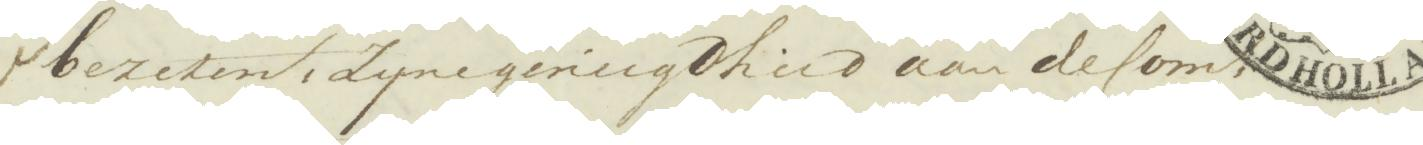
bezeten, Zyne geneigdheid aan de Com,
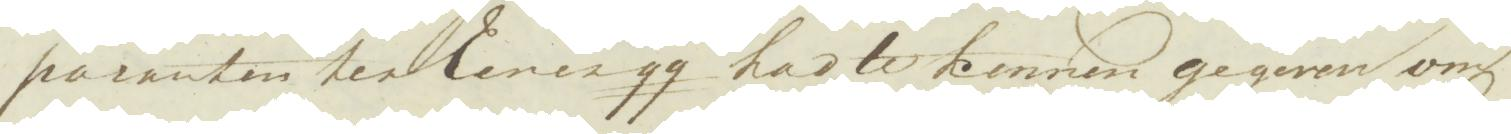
paranten ter Eener qq had te kennen gegeven om
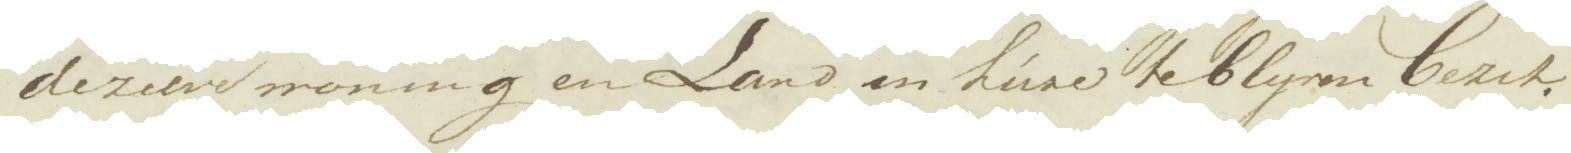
dezelve woning en Land in hure te blyven bezit„
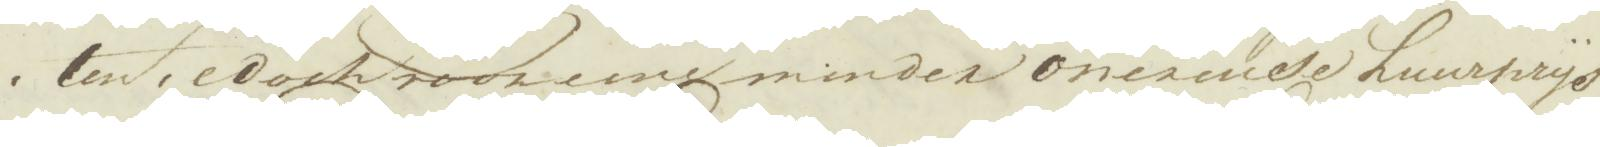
„ten, edoch voor eene minder onereuse huurprijs
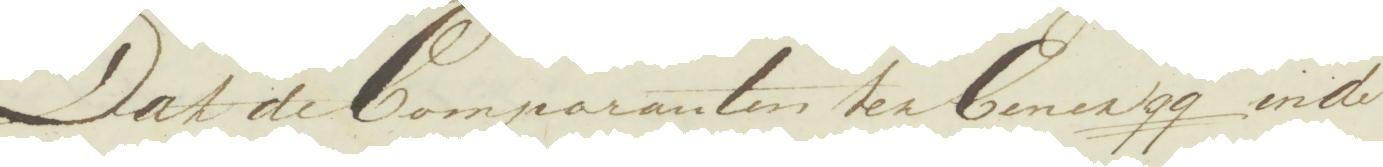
Dat de Comparanten ter Eener qq in de
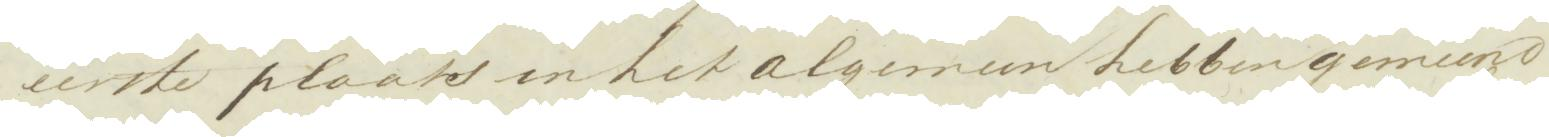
eerste plaats in het algemeen hebben gemeend
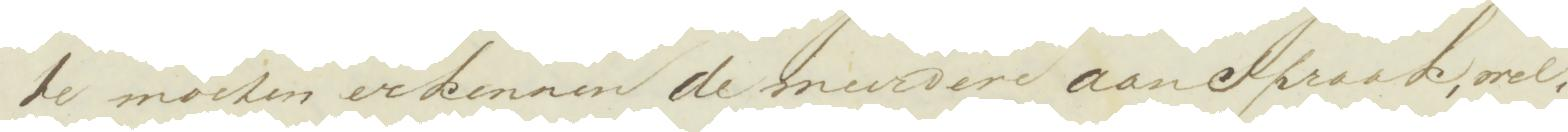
te moeten erkennen de meerdere aanspraak, wel„
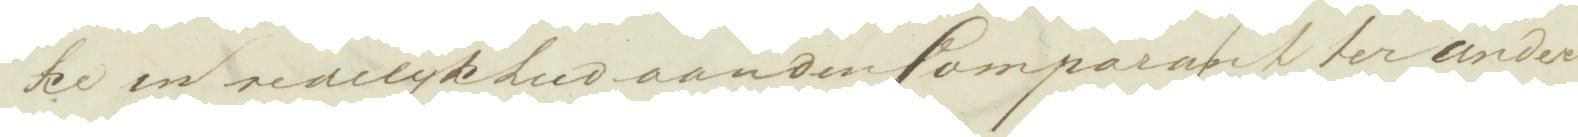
ke in redelykheid aan den Comparant ter ander
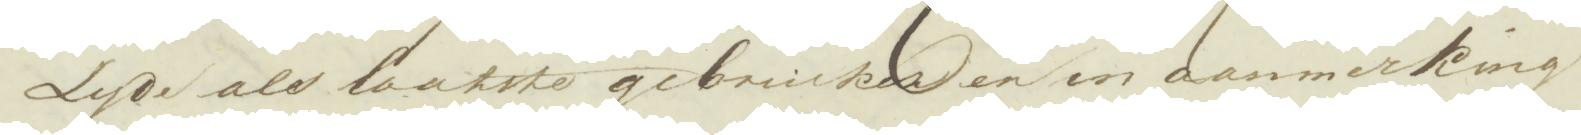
Zyde als laatste gebruiker en in aanmerking
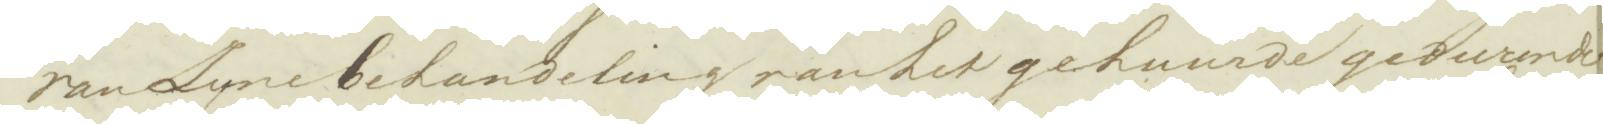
van Zyne behandeling van het gehuurde gedurende
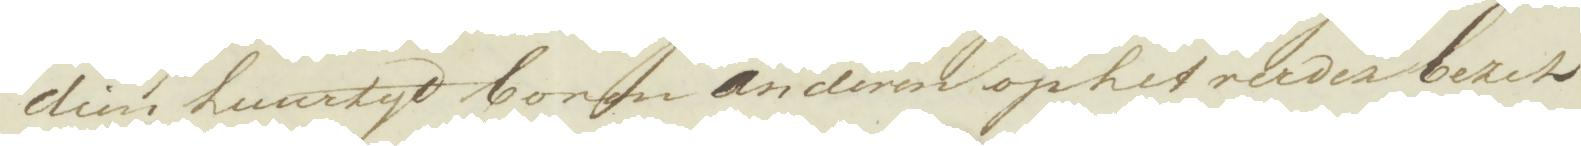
dien huurtyd boven anderen op het verder bezit
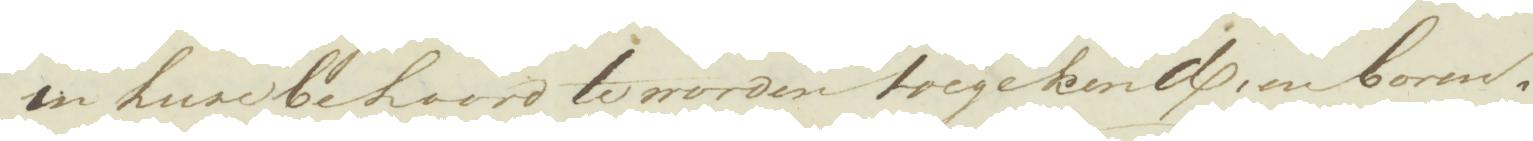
in hure behoord te worden toegekend, en boven„
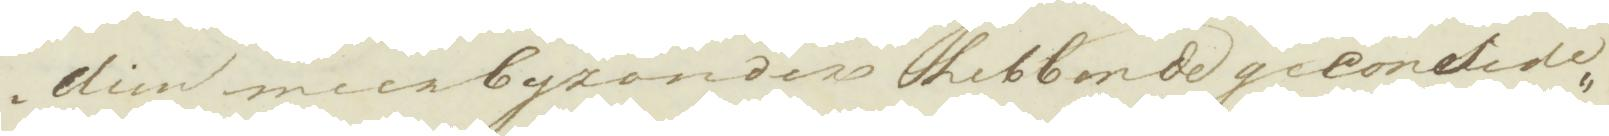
„dien meer byzonder hebbende geconside„
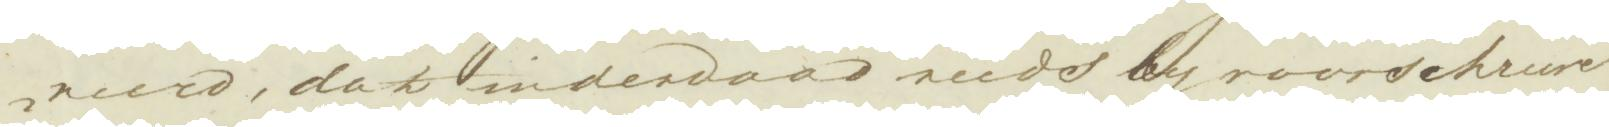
„reerd, dat inderdaad reeds by voorschreeve
